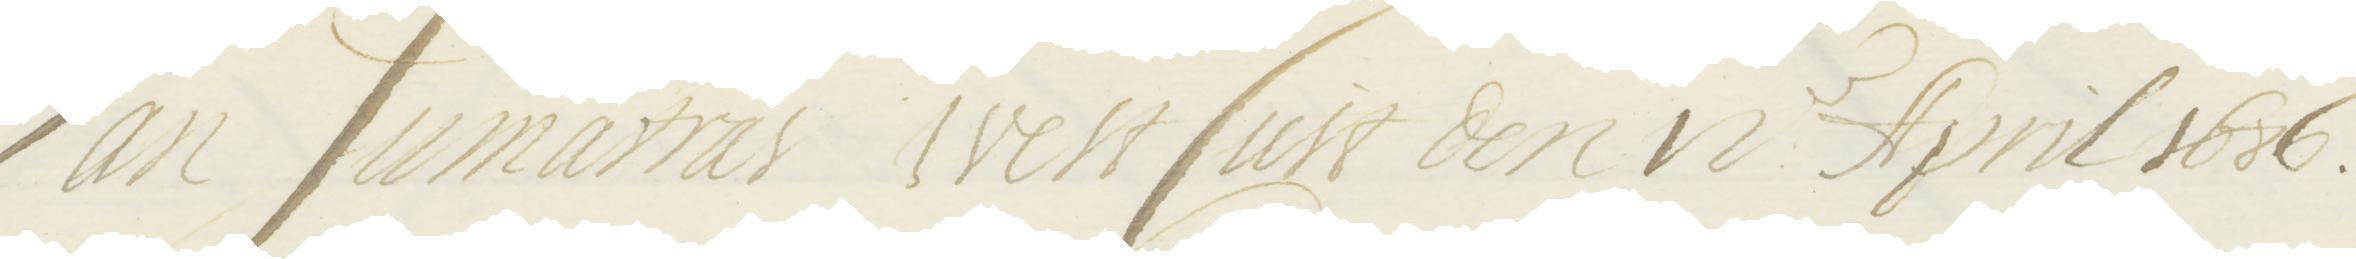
Van Sumatras west Cust den 12:e April 1686.
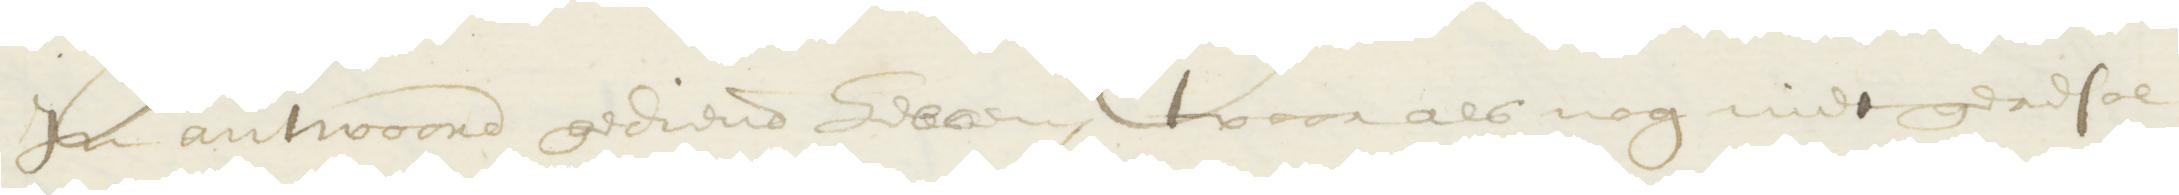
In antwoord gediend hebben 't voor als nog niet geresol
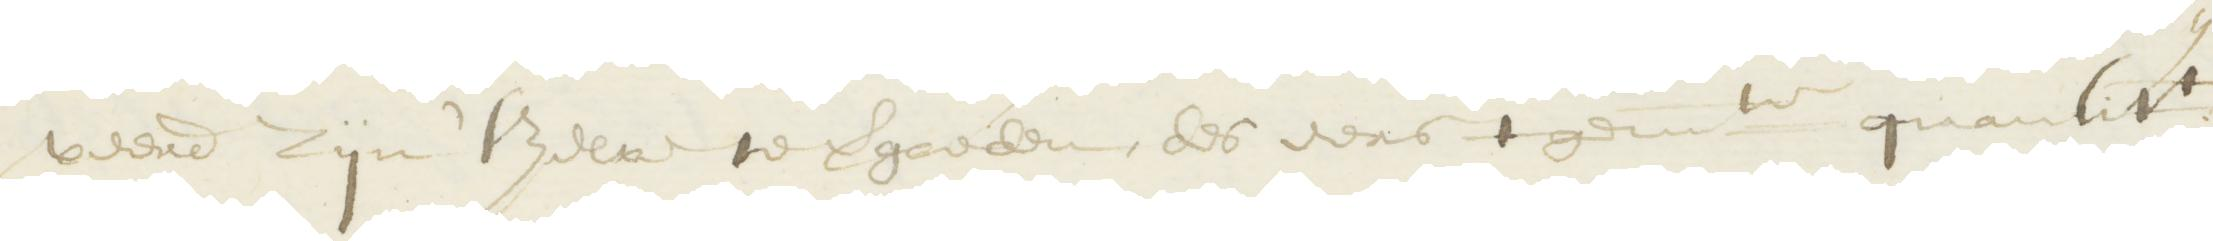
veerd zijn ’tzelve te vergoeden, des eerst gem=te quantit=t
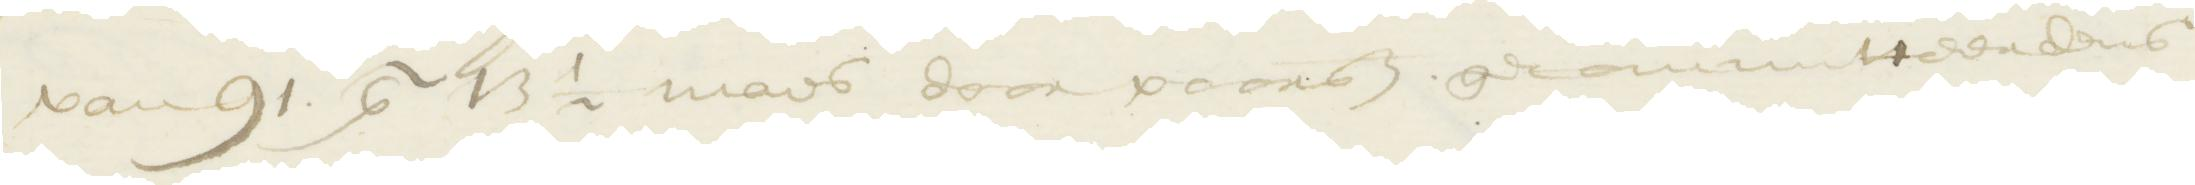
van 91 p 13½ maes door voors gecommitteerdens
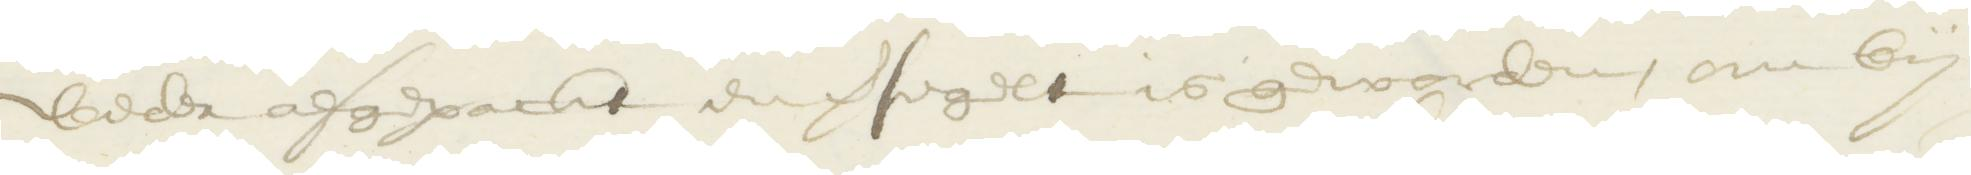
beder afgepackt en versegelt is geworden, om bij
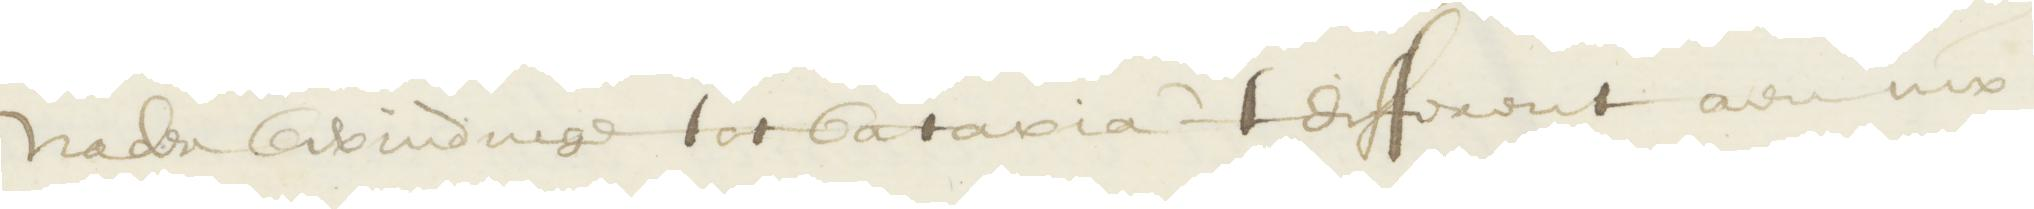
nader bevindinge tot batavia 't different aen uw
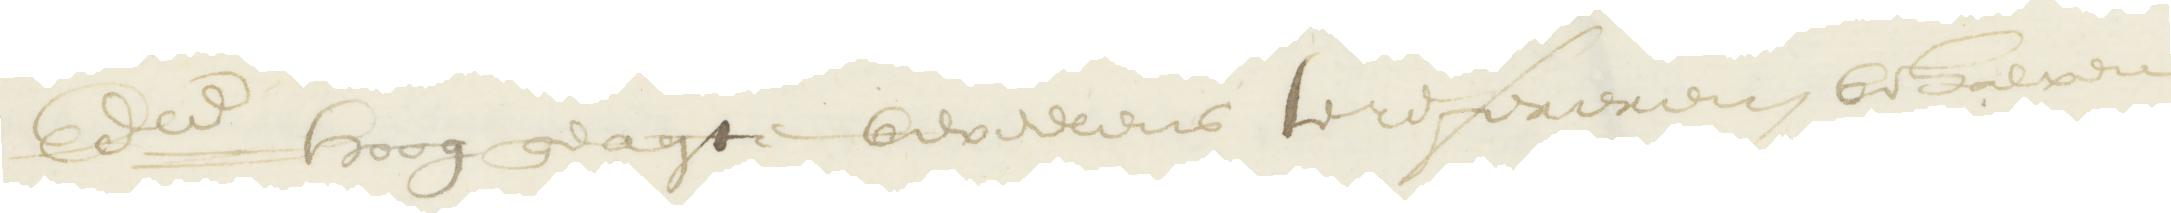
Ed=le hoog geagte beveelens terefereren, behalven
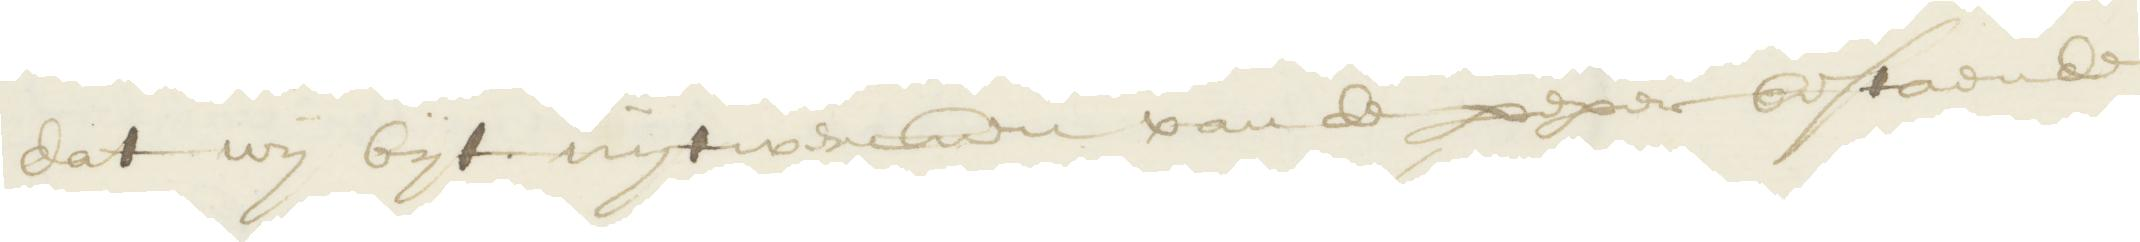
dat wij bijt uijtwercken van de peper bestaende
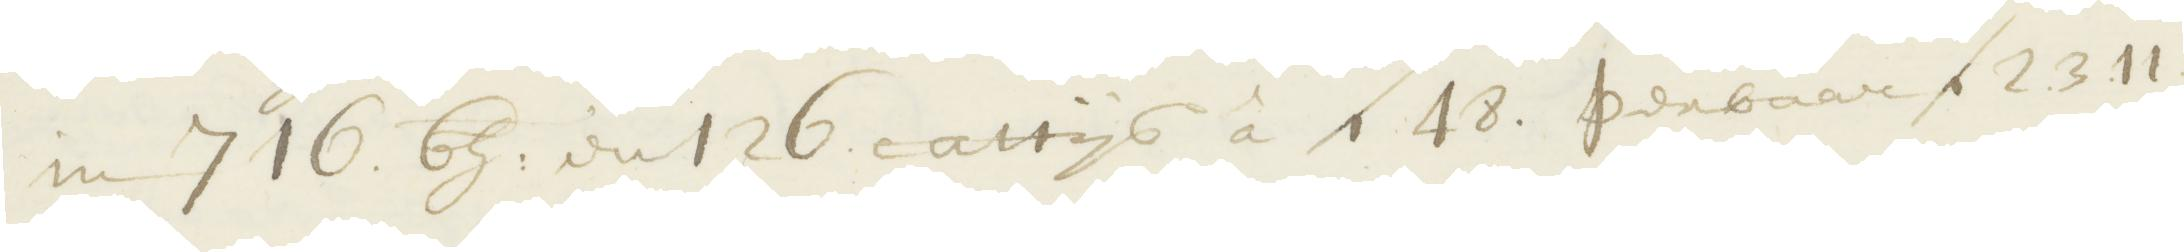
in 716. bh: en 126. cattijs à ƒ48. per baar ƒ2311
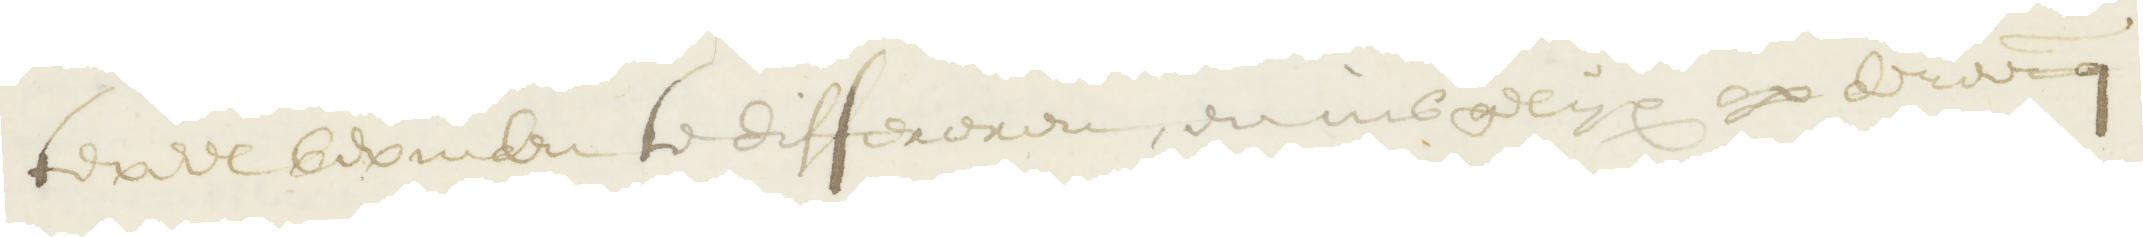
teveel bevinden te differeren, en insgelijx op dereecq.
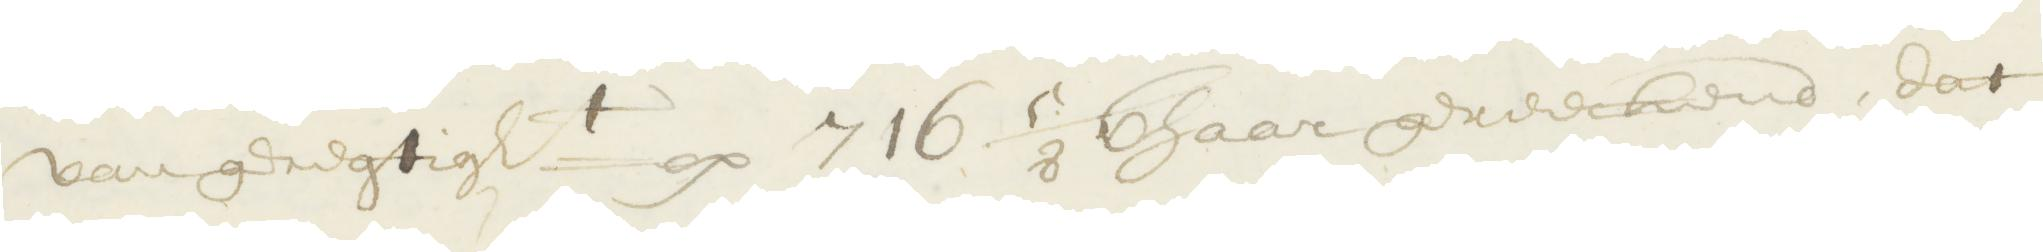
van geregtigh=t op 716 5/8 bhaar gereeckend, dat
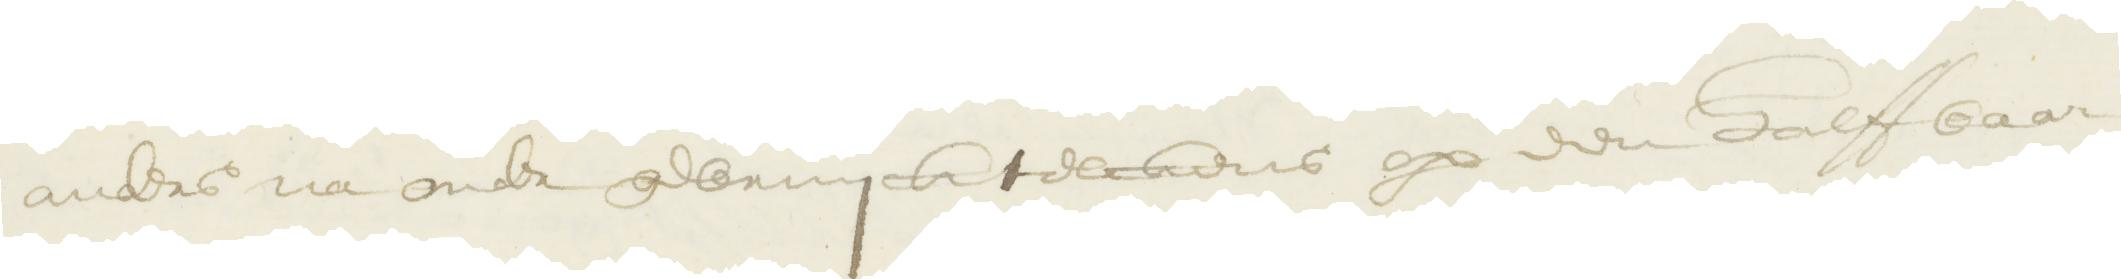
anders na onder gebruijckt deckens op een Halff baar
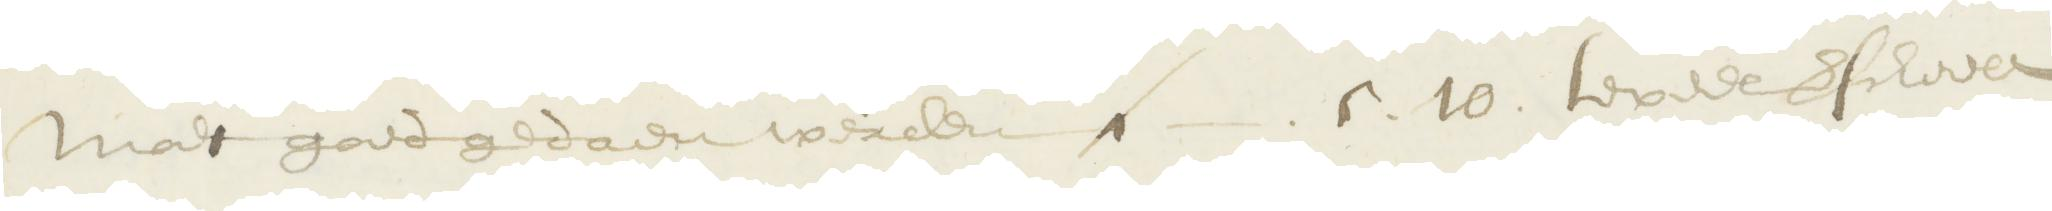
moet goed gedaen werden ƒ 5.10. teveel verscheelen
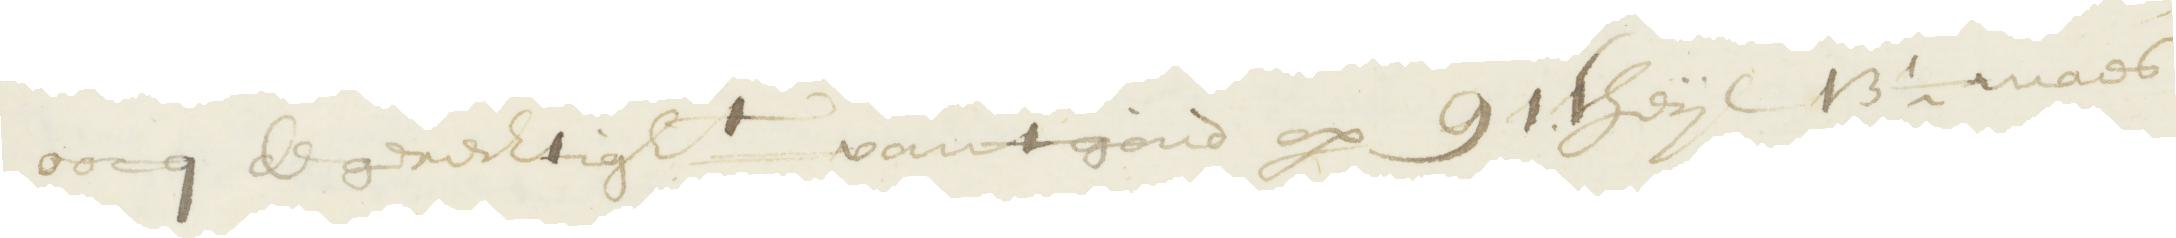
oocq de gerechtight vant goud op 91 theijl 13½ maes
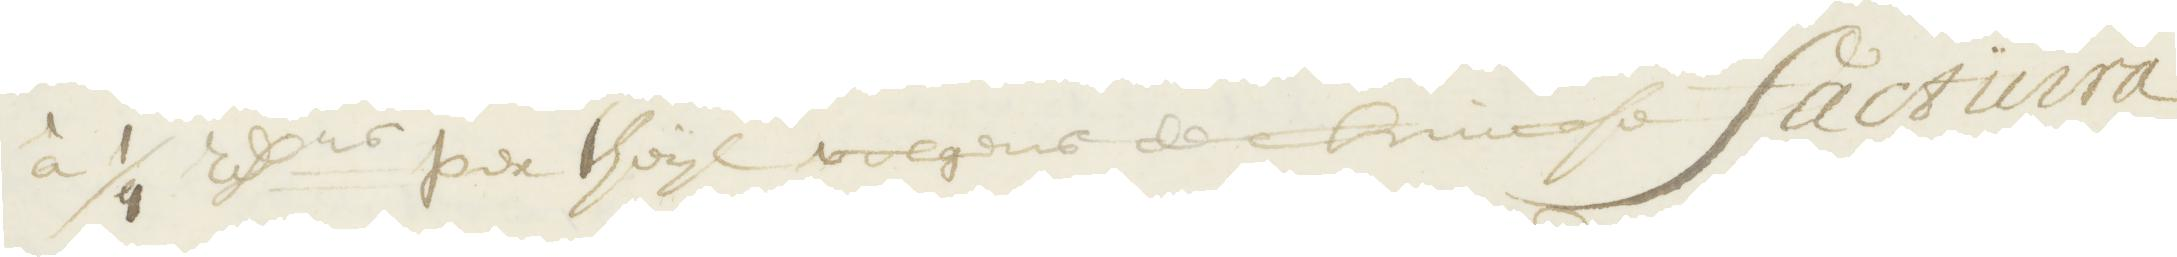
à ¼ rx=rs per theijl volgens de chincose factuira
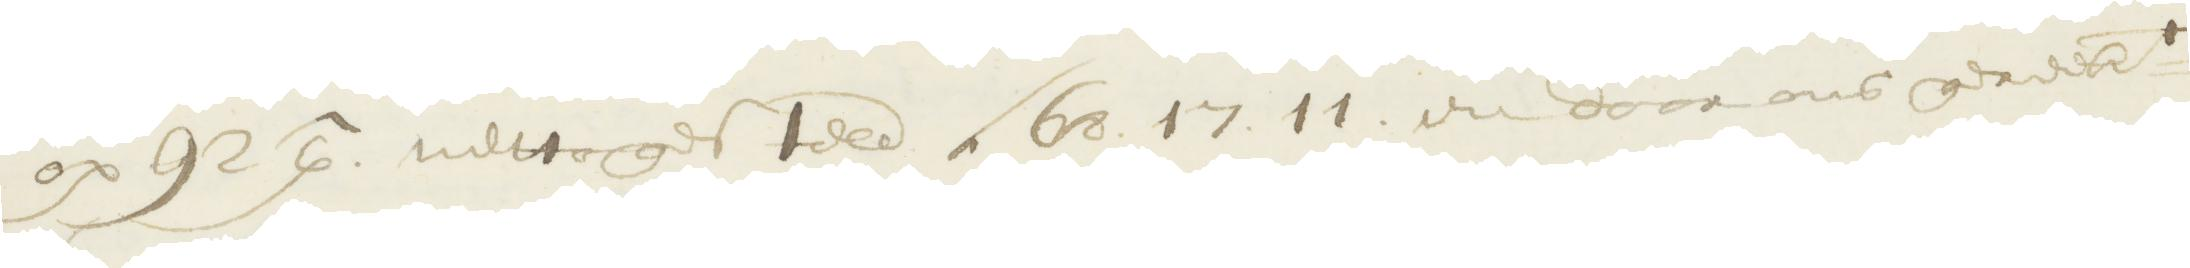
op 92 p netto gesteld ƒ 68. 17. 11. en door ons gereek:t
